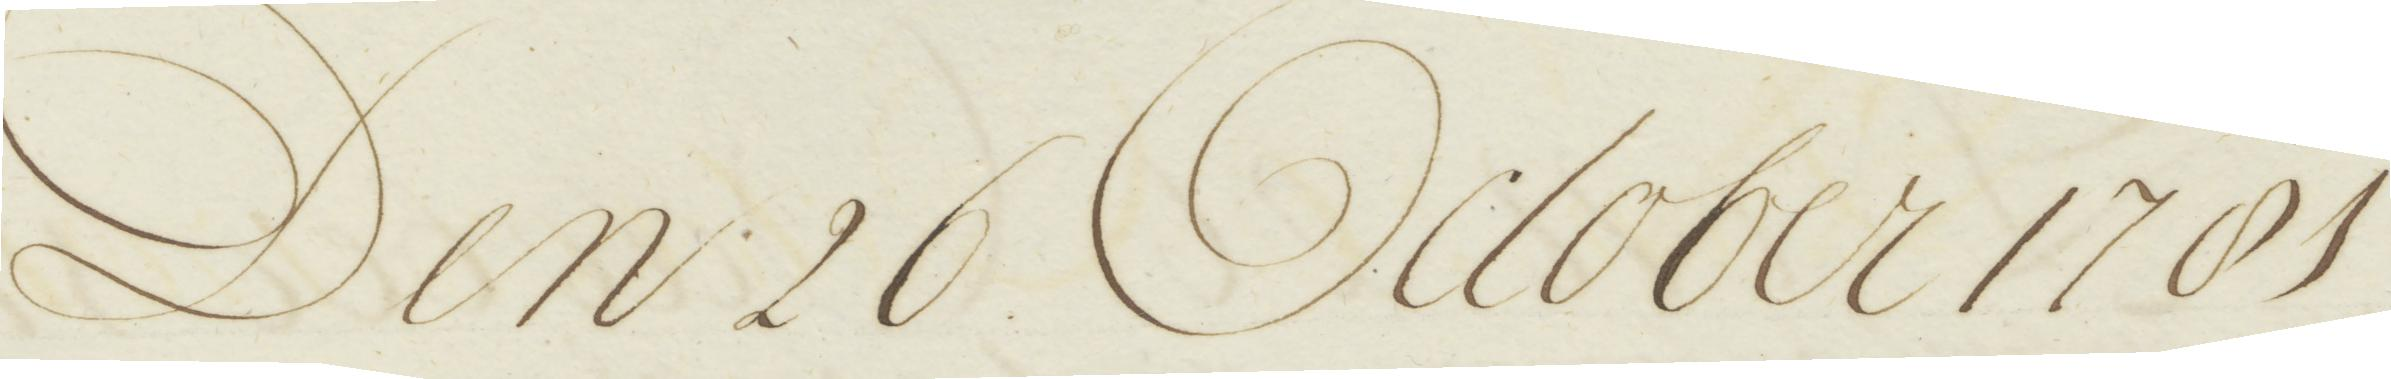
Den 26 October 1781
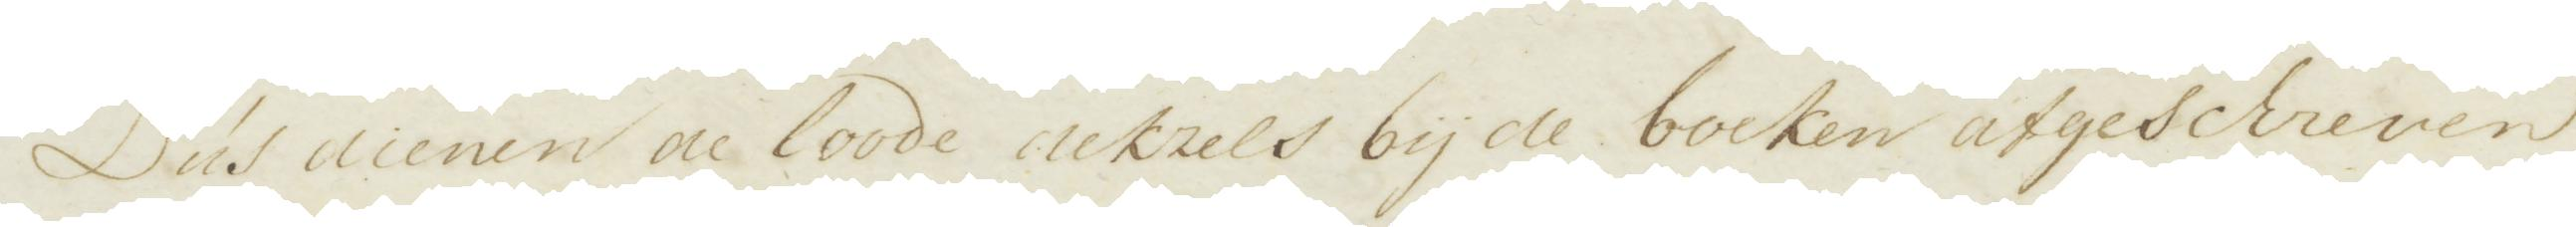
Dus dienen de loode dekzels bij de boeken afgeschreven
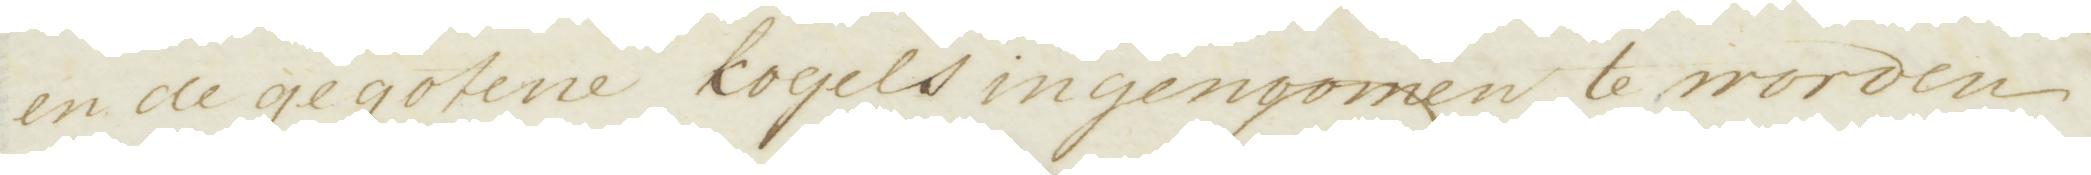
en de gegotene kogels ingenoomen te worden
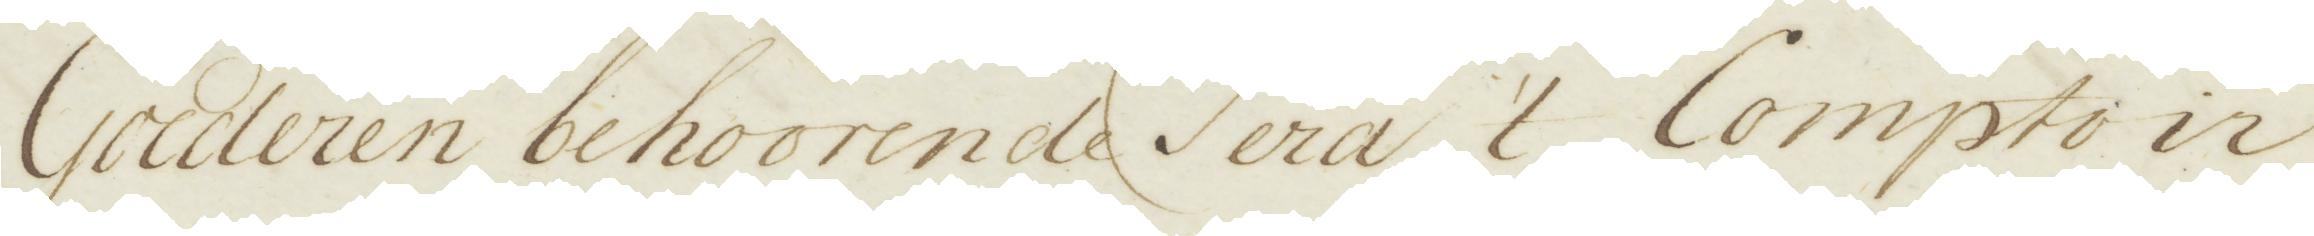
Goederen behoorende Pera ’t Comptoir
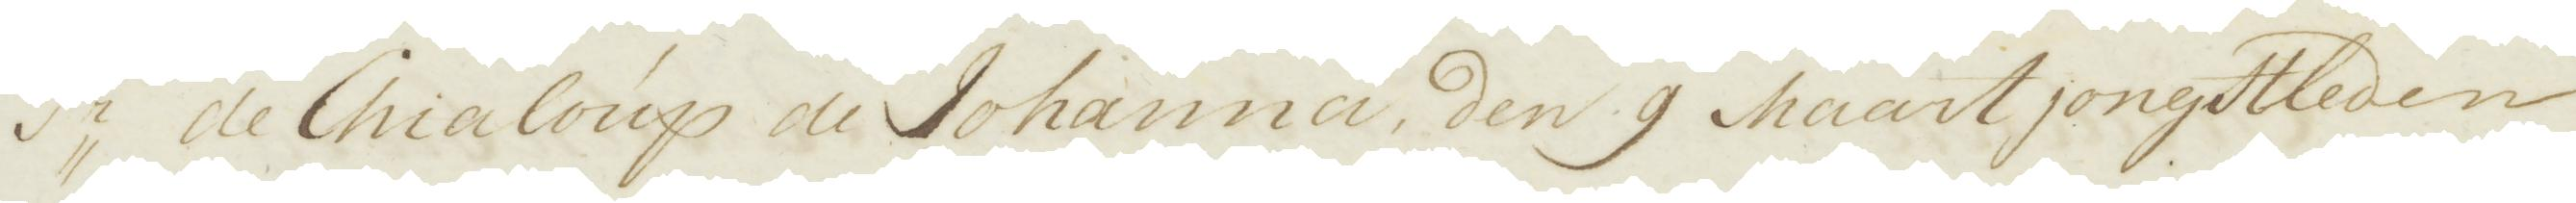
P„r de Chialoup de Johanna, den 9 Maart jongstleden
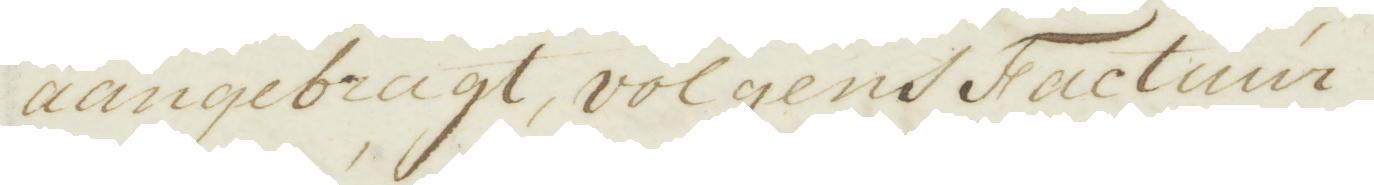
aangebragt, volgens Factuur
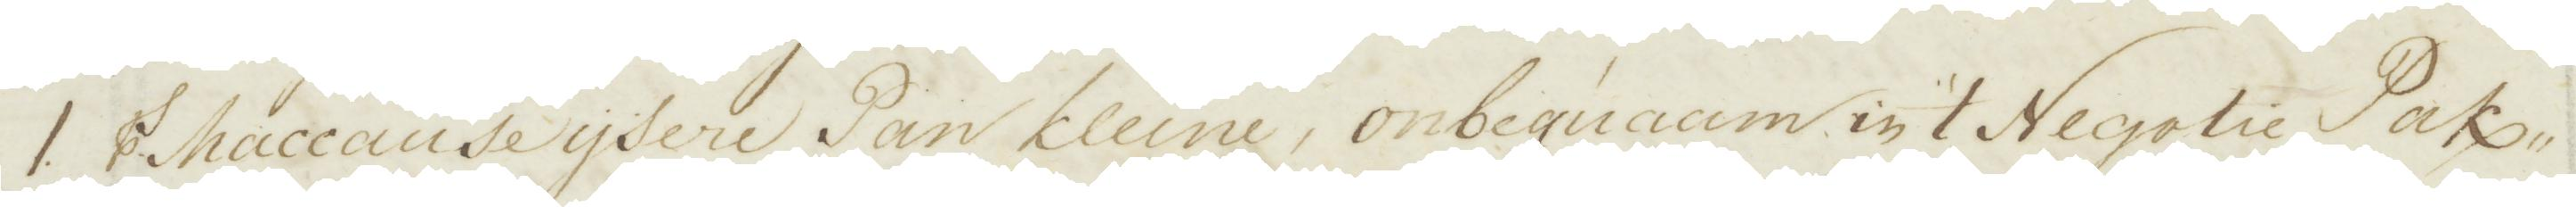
1. p.s Maccause ijsere Pan kleine, onbequaam in ’t Negotie Pak„
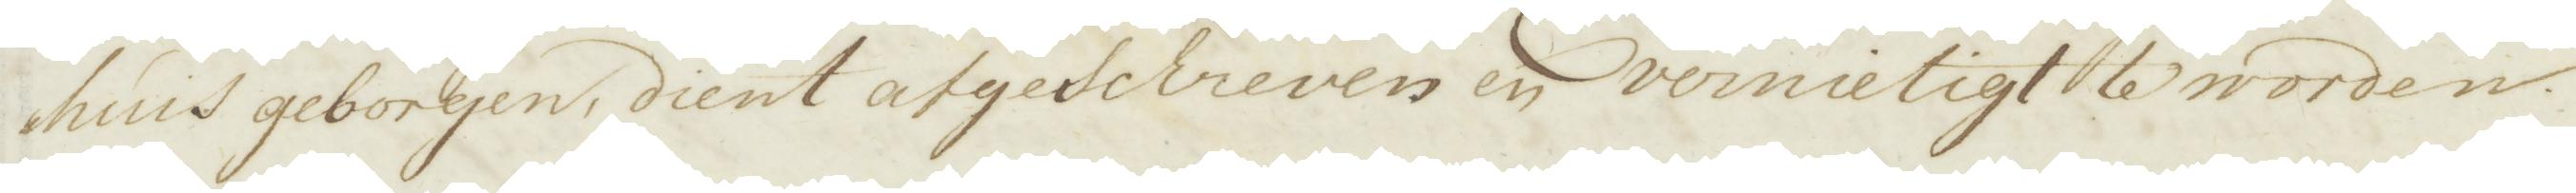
„huis geborgen, dient afgeschreven en vernietigt te worden.
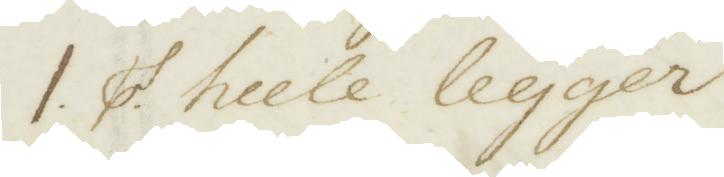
1. p.s heele legger
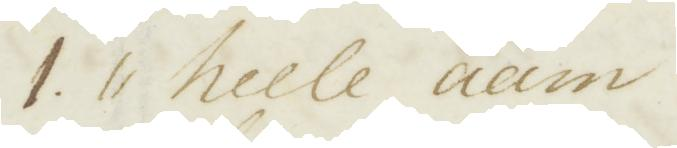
1. „ heele aam
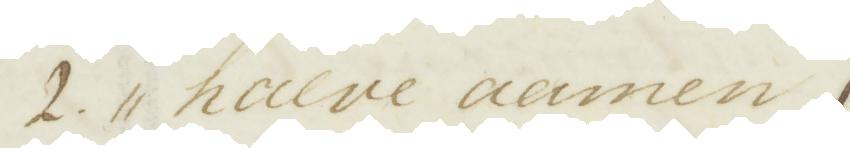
2. „ halve aamen
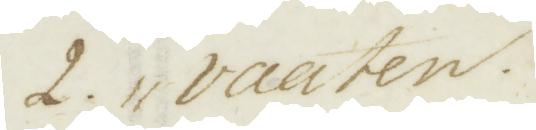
2. „ vaaten.
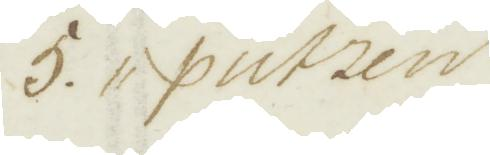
5. „ putzen
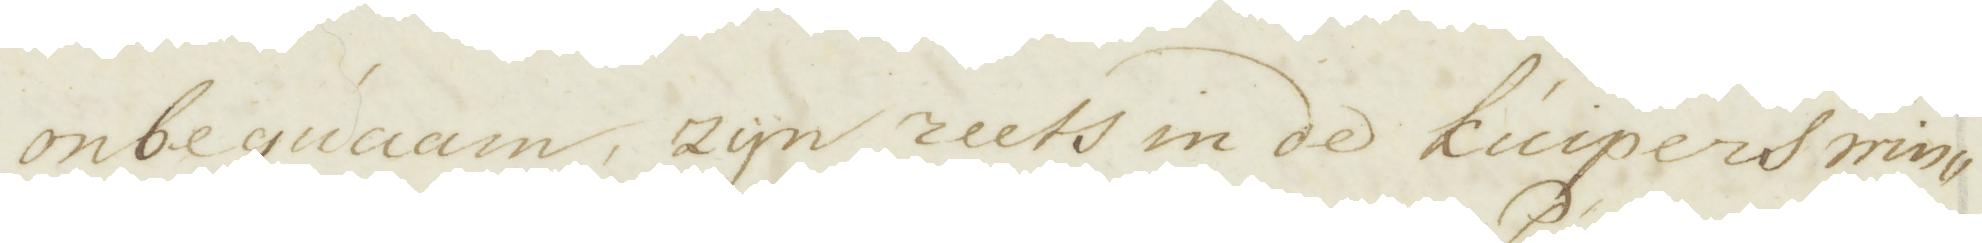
onbequaam, zijn reets in de kuipers win
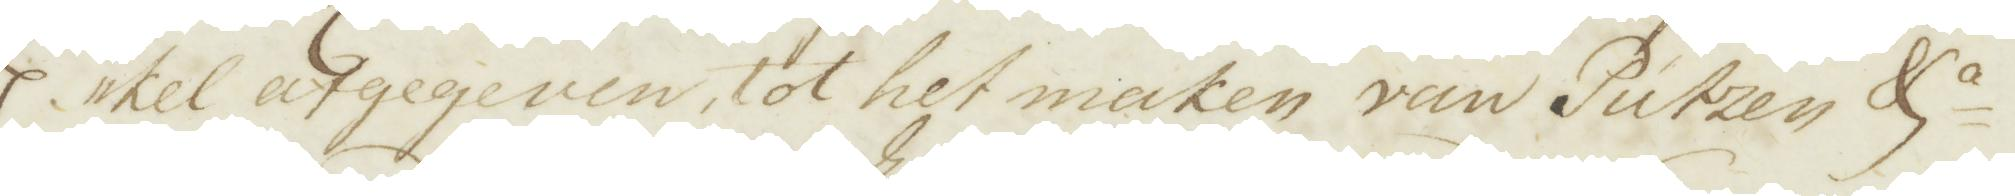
. „kel afgegeven, tot het maken van Putzen &=a
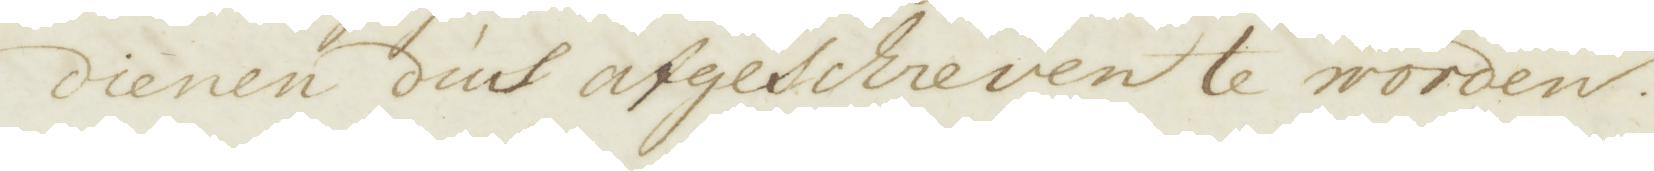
dienen dus afgeschreven te worden.
